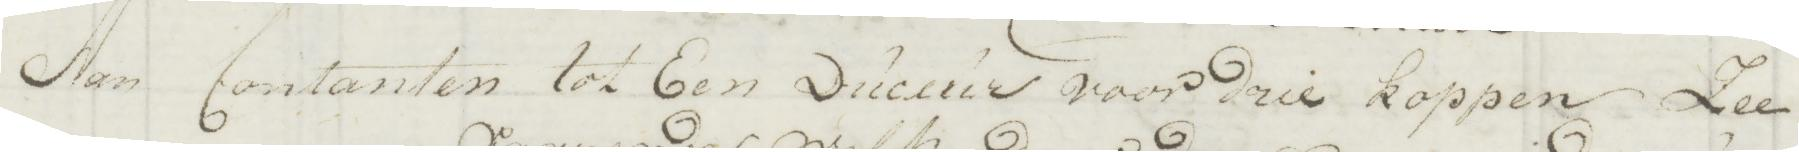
Aan Contanten tot Een Duceur voor drie koppen Zee
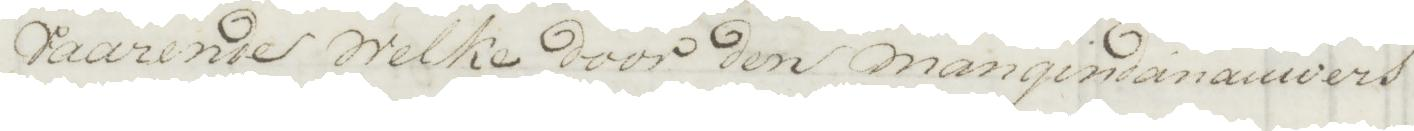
vaarende welke door den mangindanauwers
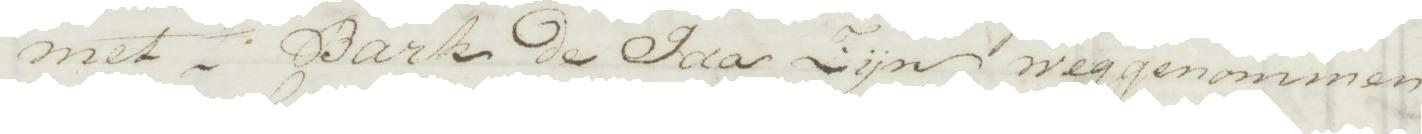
met t Bark de Iaa zijn weggenommen
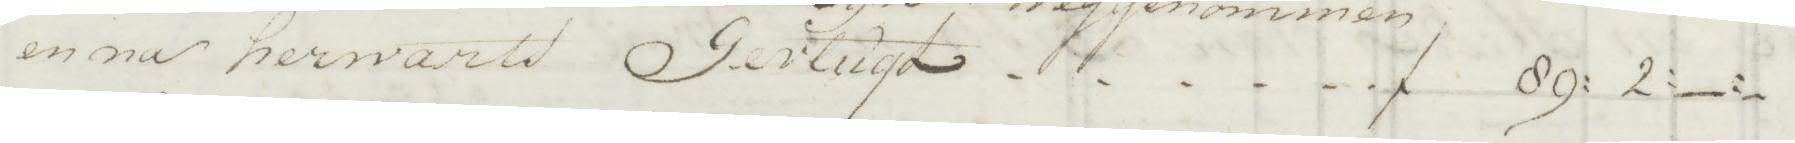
en na herwarts gevlugt - - - - - . ƒ 89: 2:—:-
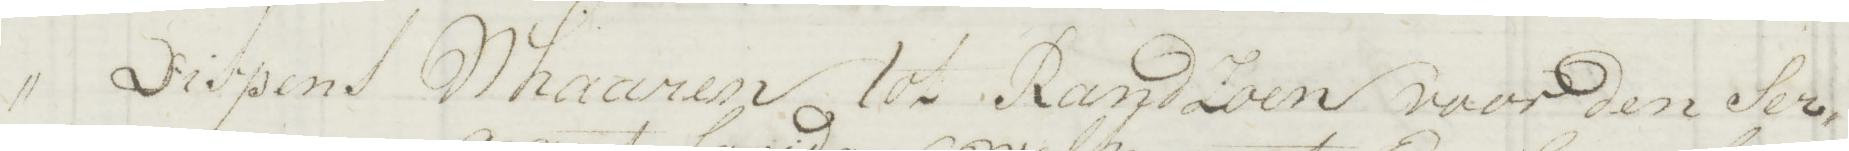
„ Dispens Whaaren tot Randzoen voor den ser„
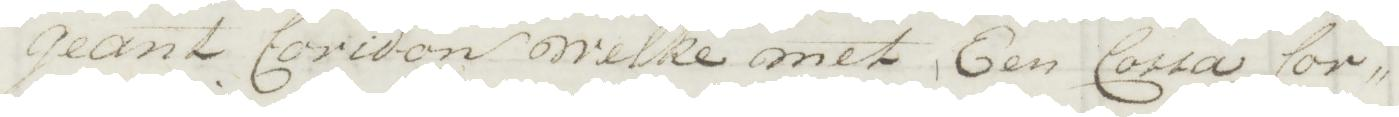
geant Coridon welke met Een Cossa Cor„
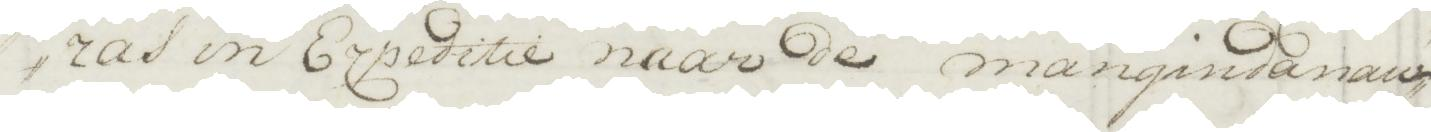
„ras in Expeditie naar de mangindanau„
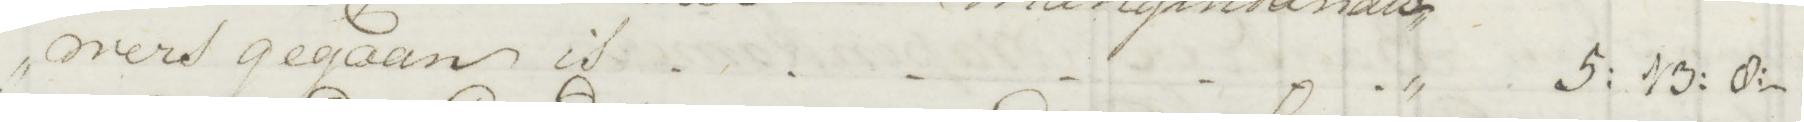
„wers gegaan is . . - - - - . „ 5: 13: 8:-
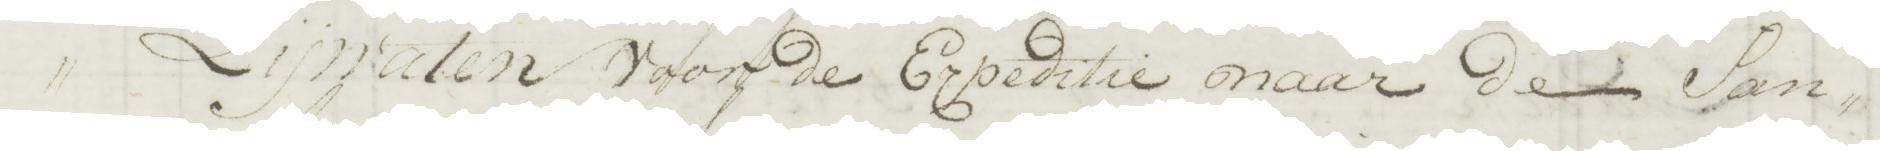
„ Lijwaten voor de Expeditie naar de San„
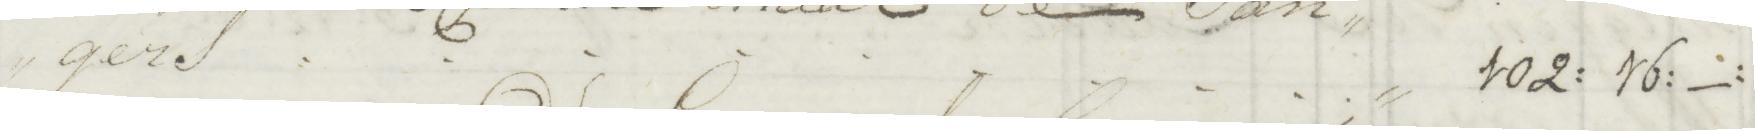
„gers . . - - . - . - . . „ 102: 16:—:
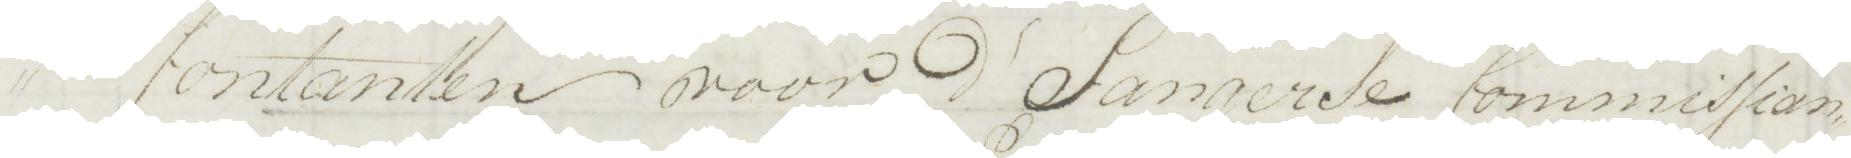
„ Contanten voor d' Sangerse Commissian„
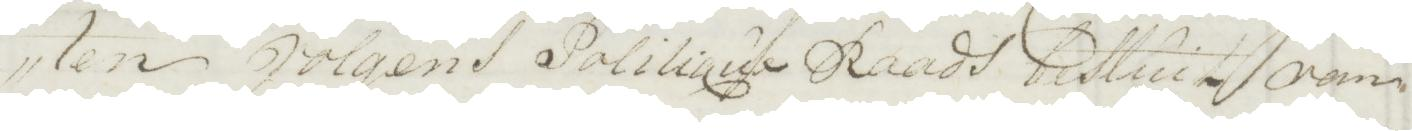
„ten volgens Politique Raads besluit van
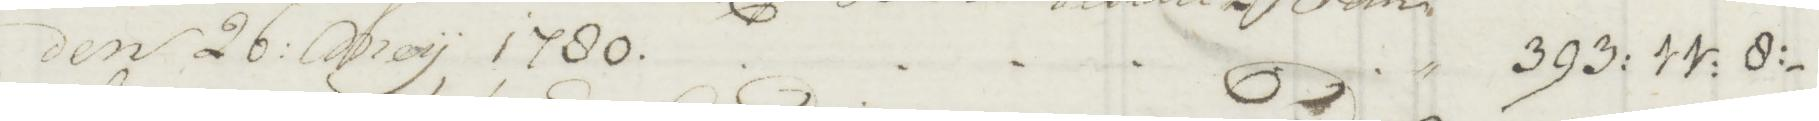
den 26: meij 1780. . - - - . . „ 393: 11: 8:–
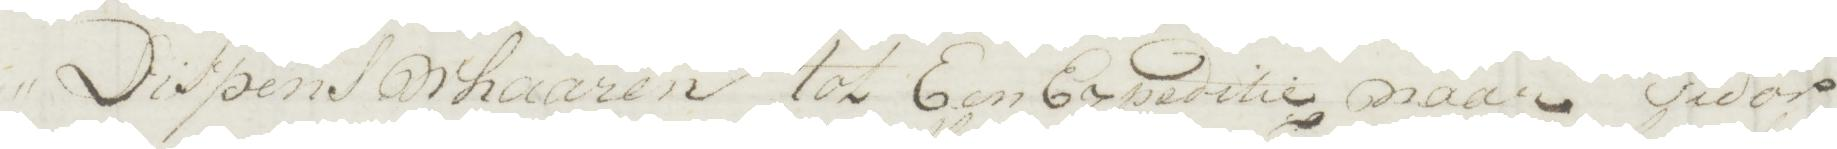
„ Dispens whaaren tot Een Expeditie naar Tidor
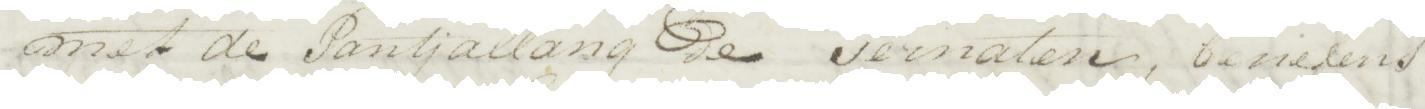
met de Pantjallang de Ternaten, bevielens
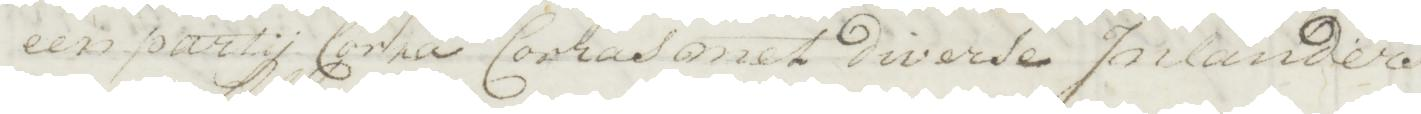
een partij Corra Corras met diverse Jnlander
